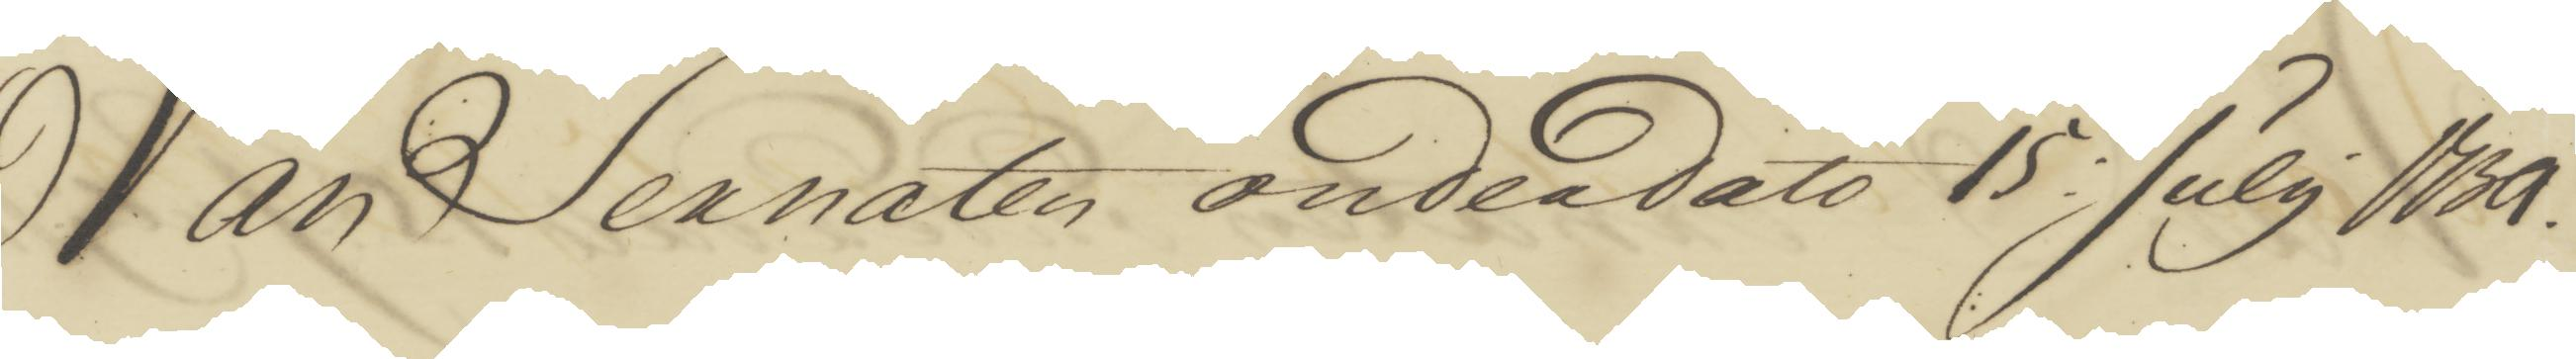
Van Ternaten onder dato 15:' Julij 1734.
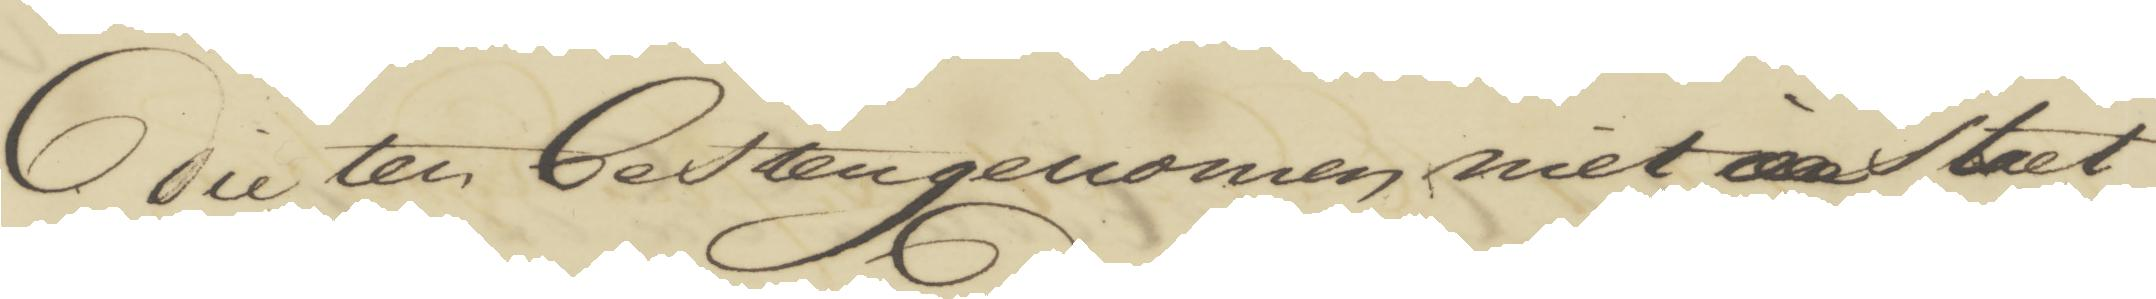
die ten besten genomen niet in staet
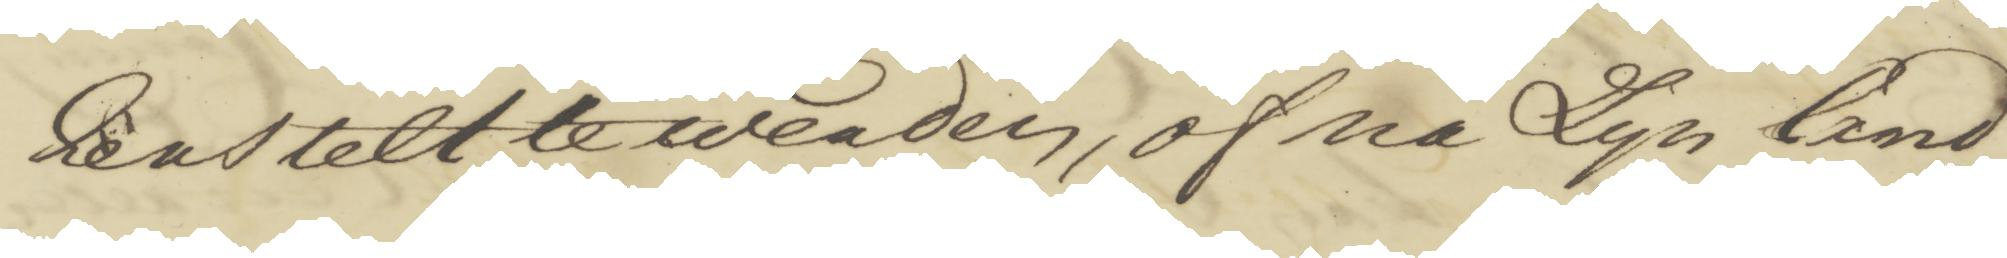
herstelt te werden, of na zyn land
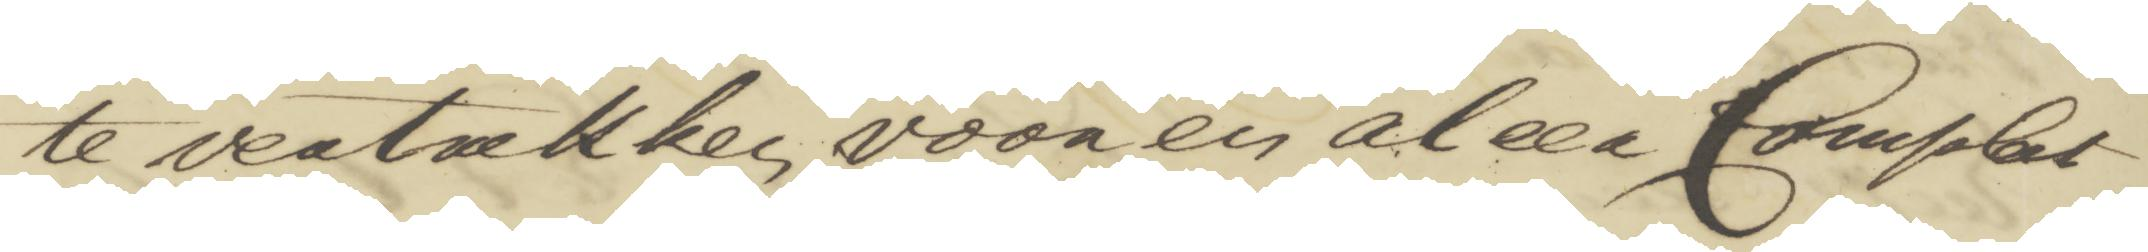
te vertrekken, voor en al eer Compleet
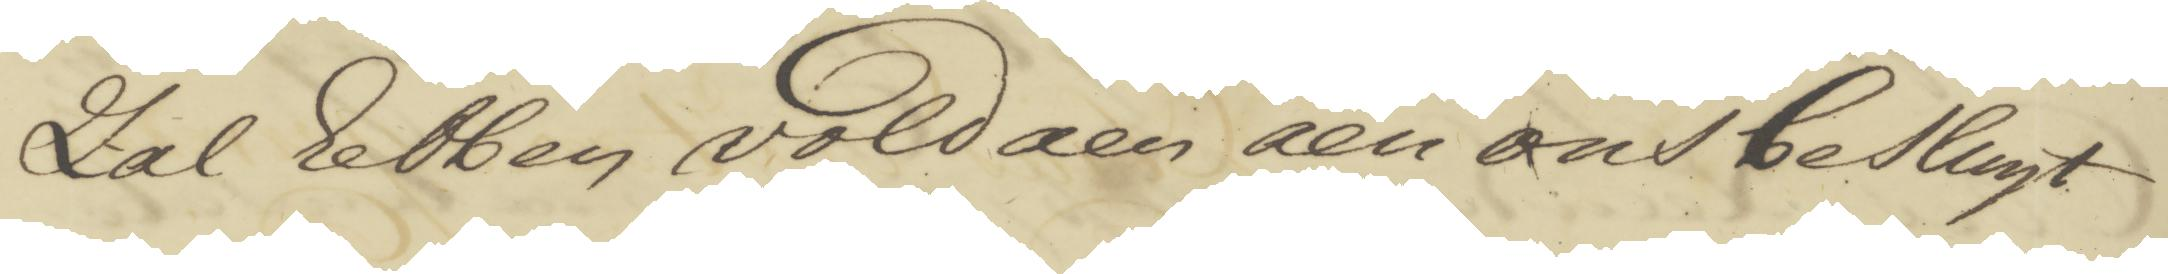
zal hebben voldaen aen ons besluyt
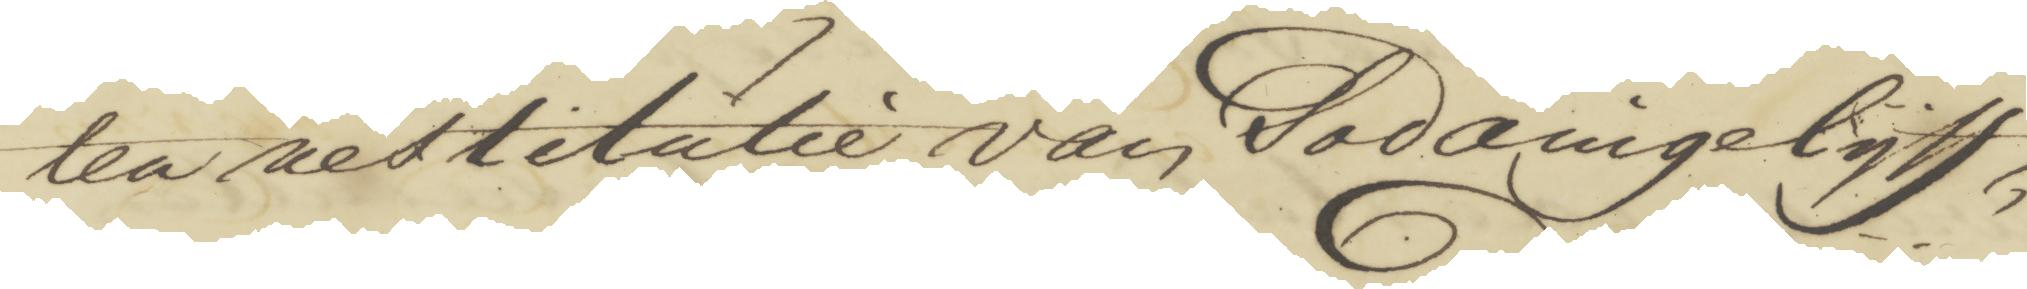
ter restitutie van sodanige lijff
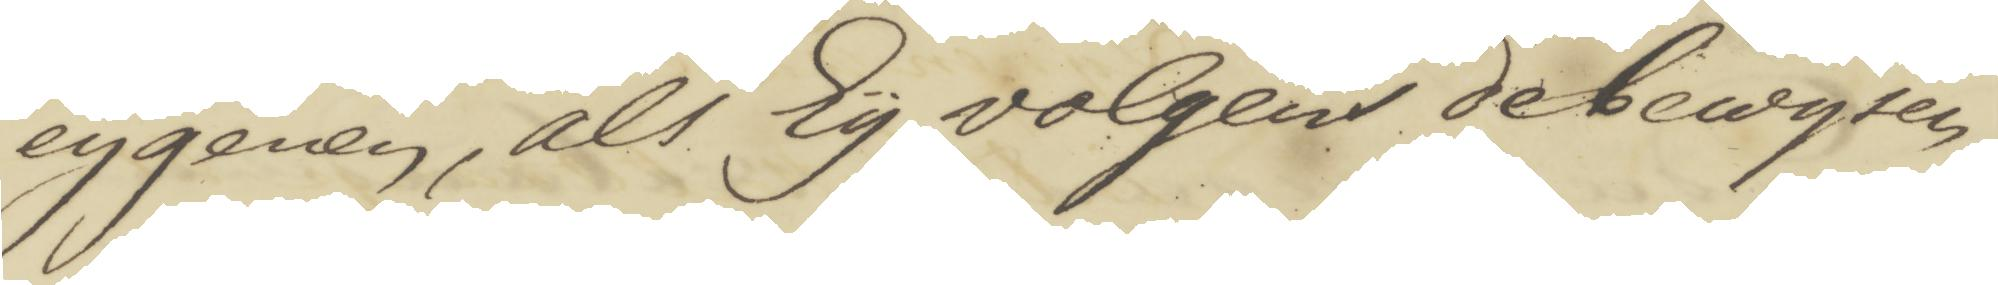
eijgenen, als hij volgens de bewijsen
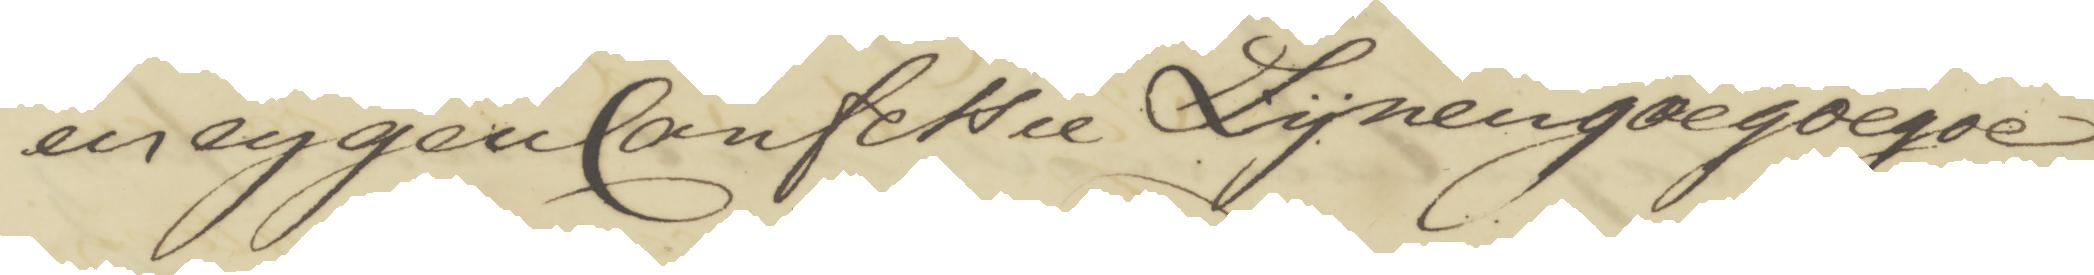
en eygen Confessie zijnen goegoegoe
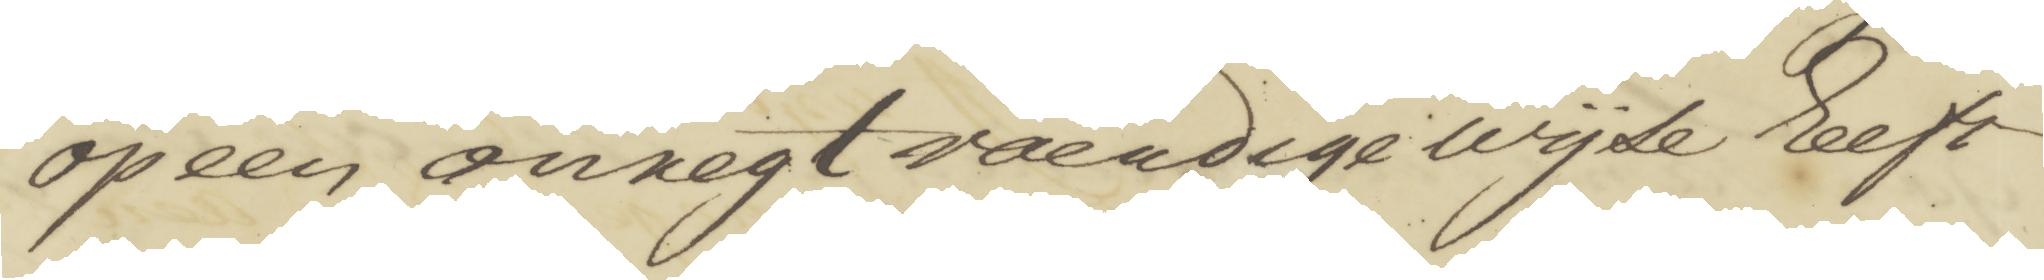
op een onregtvaerdige wijse heeft
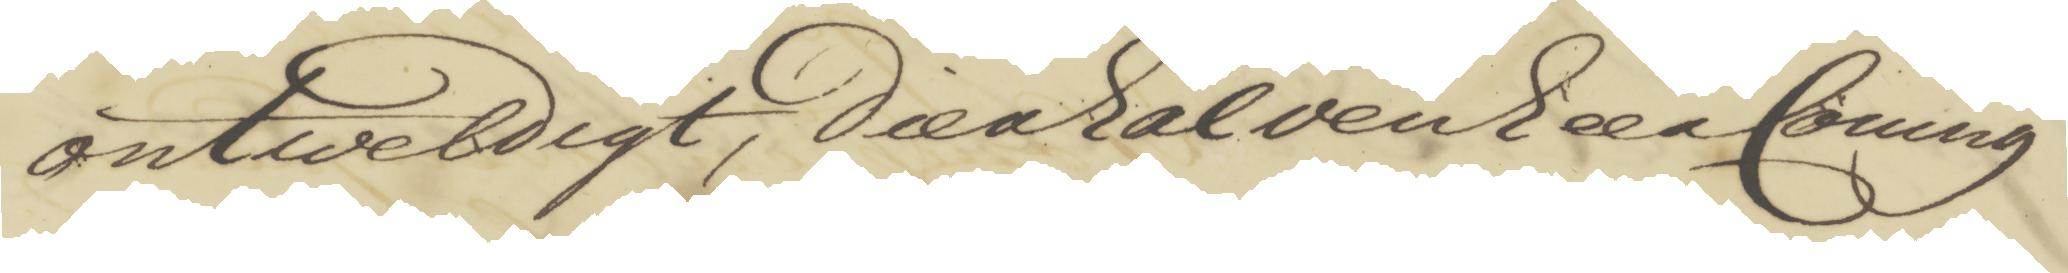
ontweldigt, dierhalven heer Coning
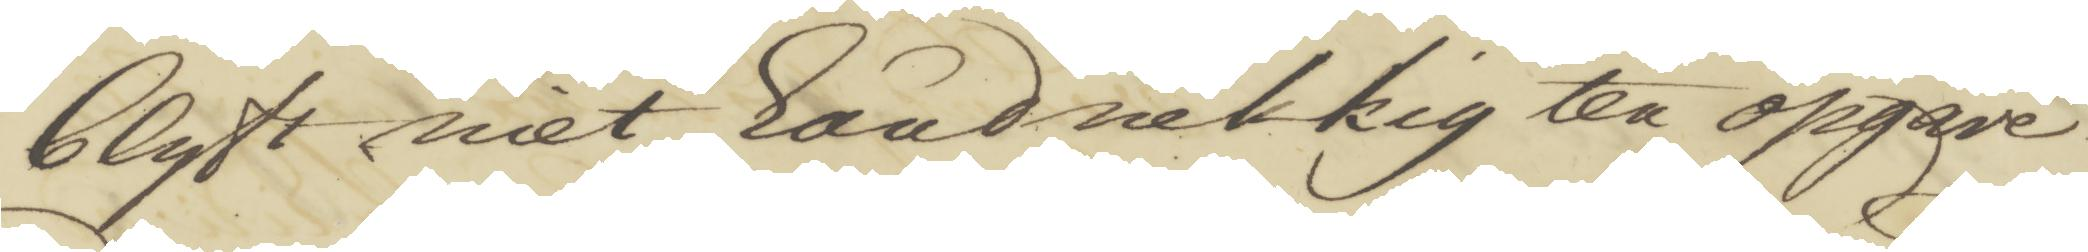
blyft niet hardnekkig ter opgave
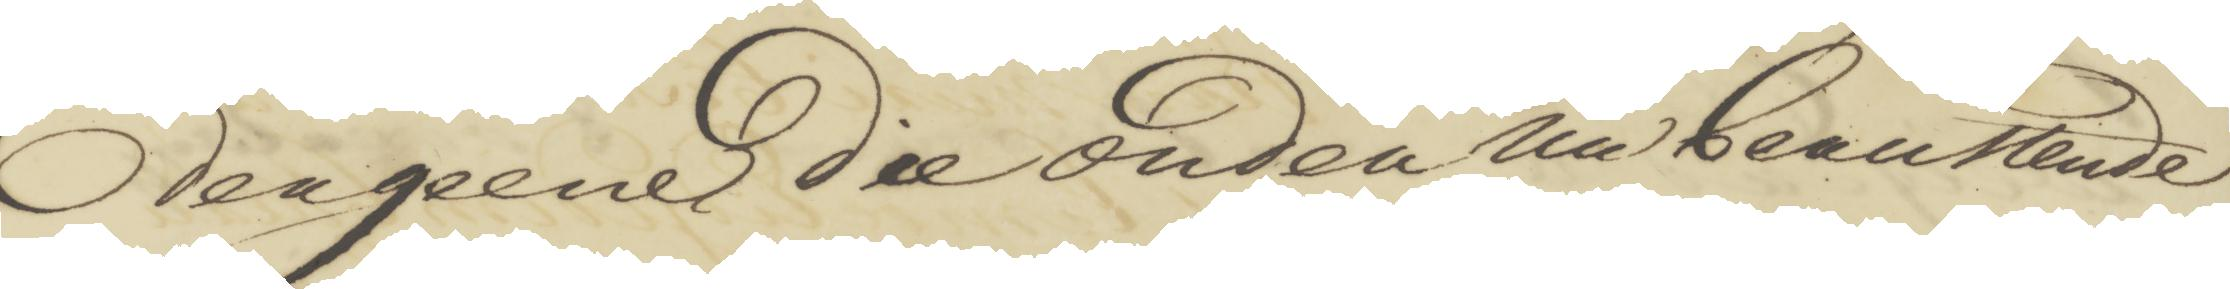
der geene die onder uw berustende
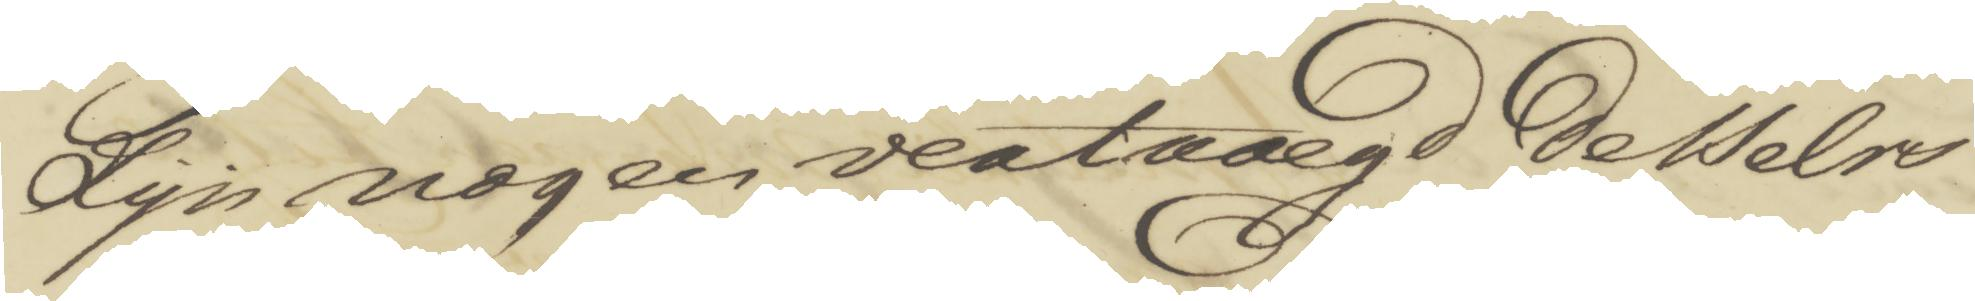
zijn nog en vertraegd desselvs
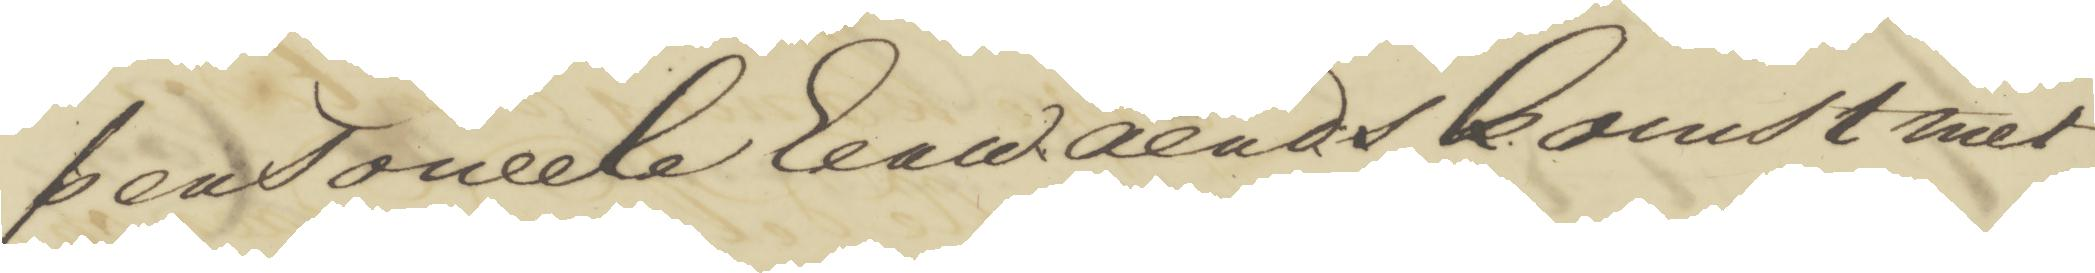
personeele herwaerds komst niet
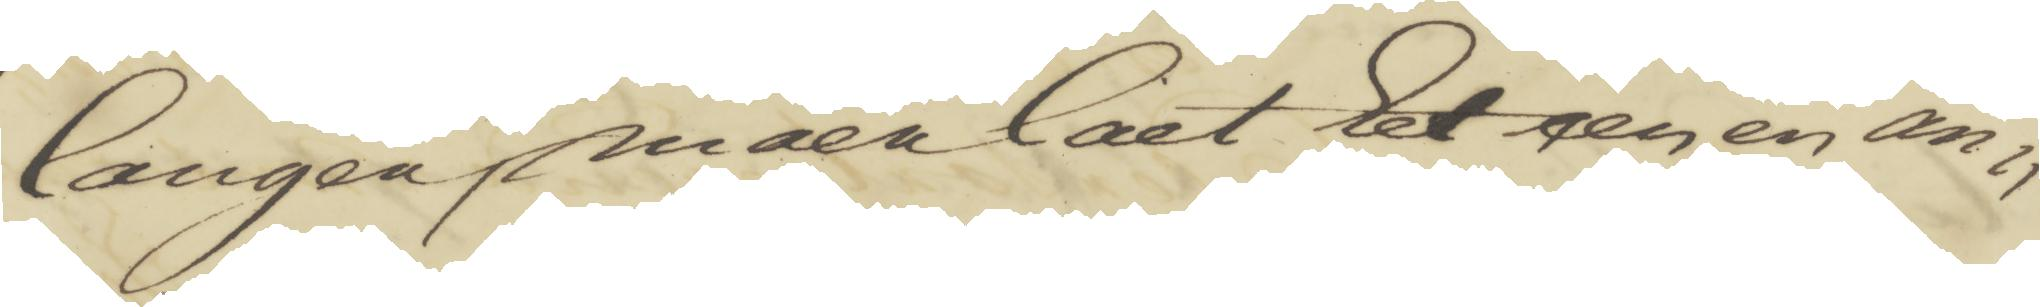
langer, maer laet het een en an
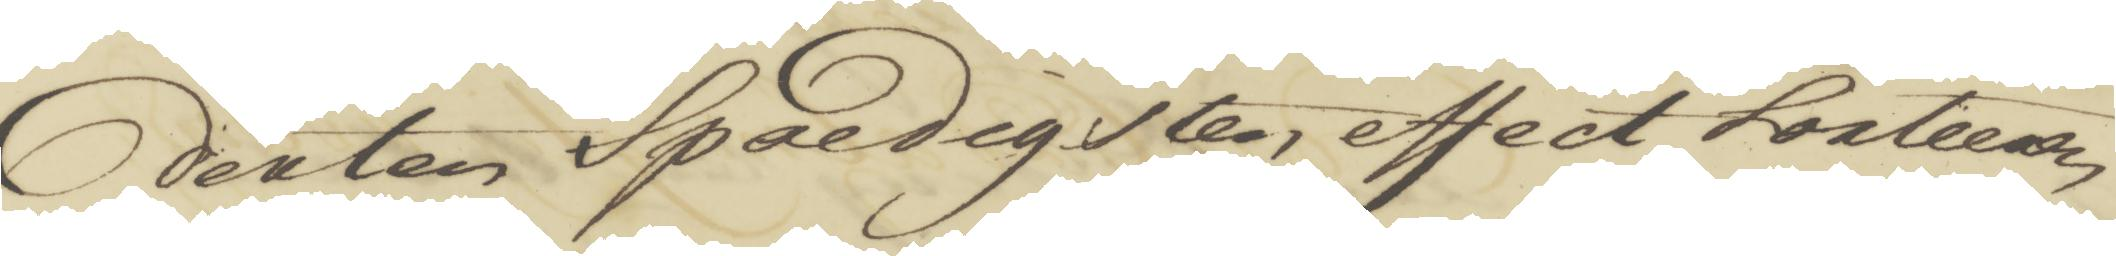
der ten spoedigsten effect sorteeren
